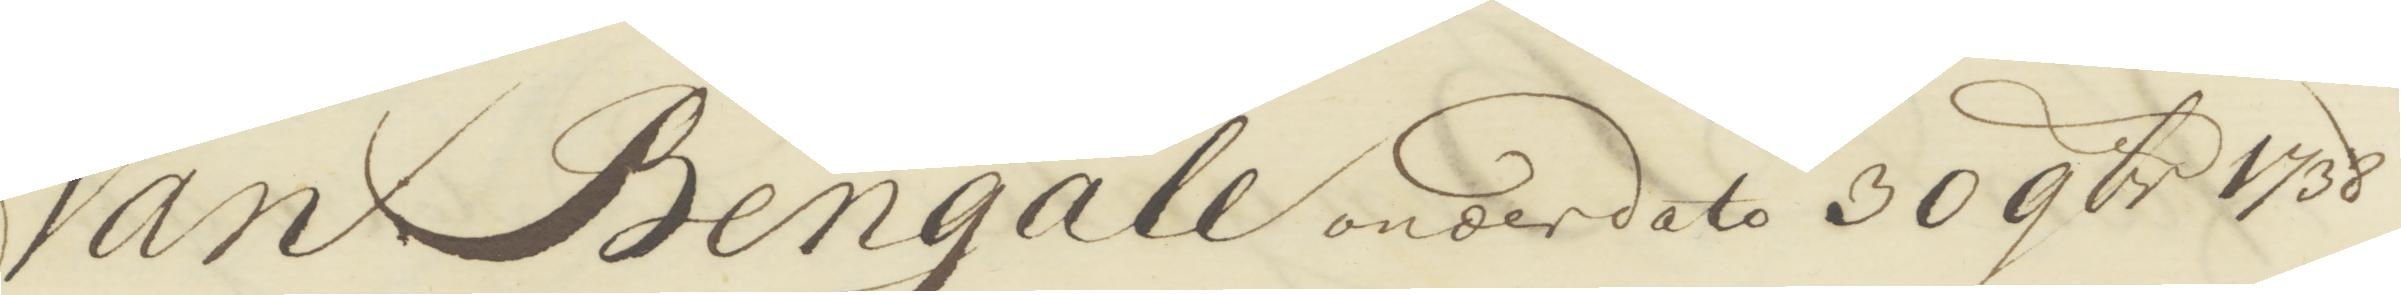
Van Bengale onder dato 30 9br 1738
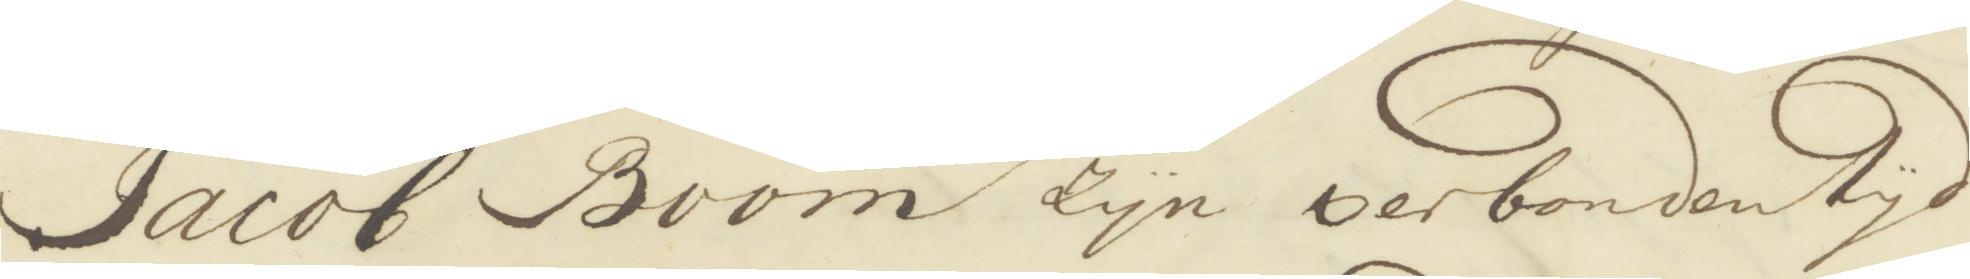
Iacob Boom zijn verbonden tijd
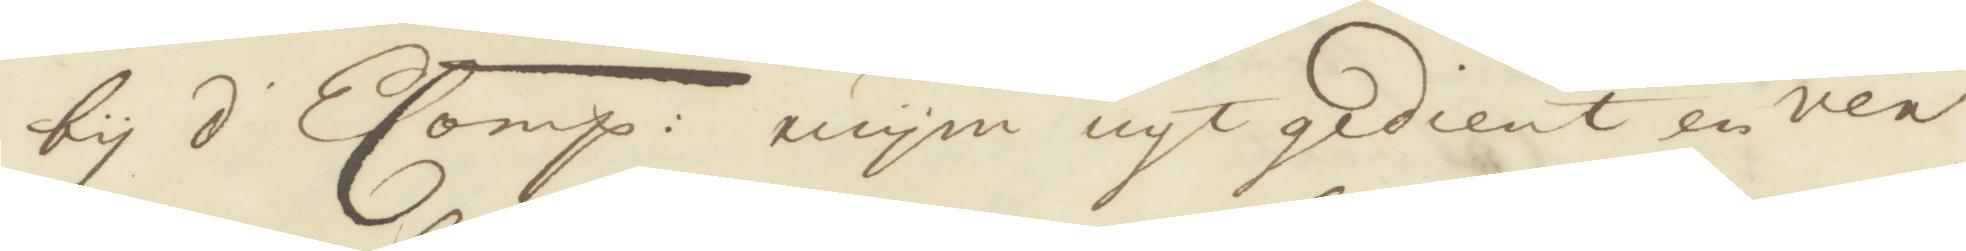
bij d’ EComp: ruijm uyt gedient en ver
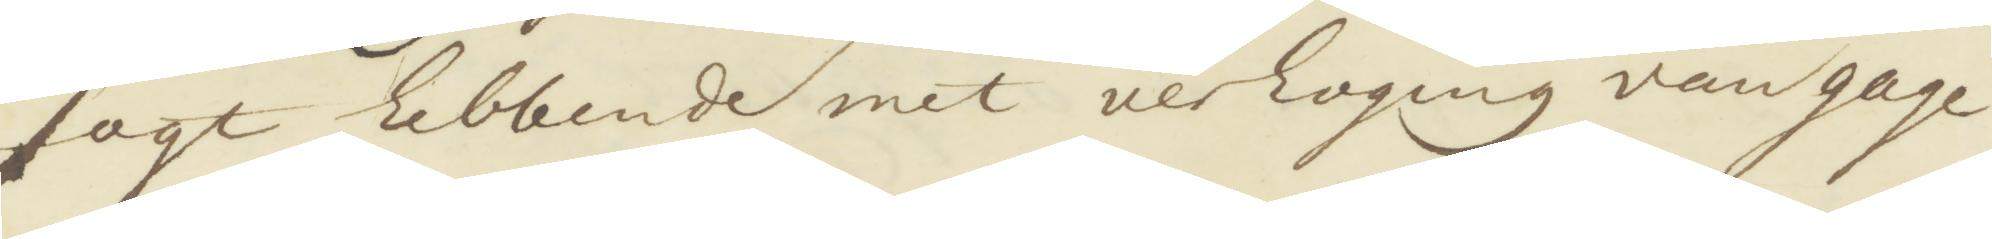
sogt hebbende met verhoging van gage
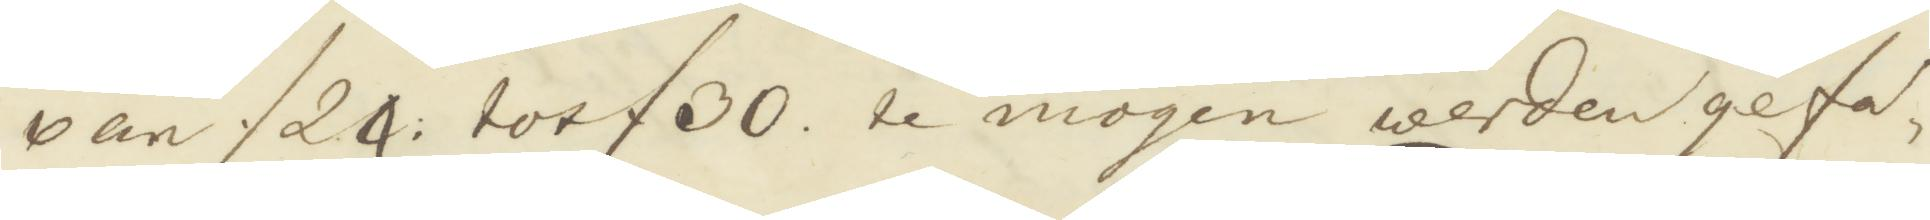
van ƒ24: tot ƒ30. te mogen werden gefa„
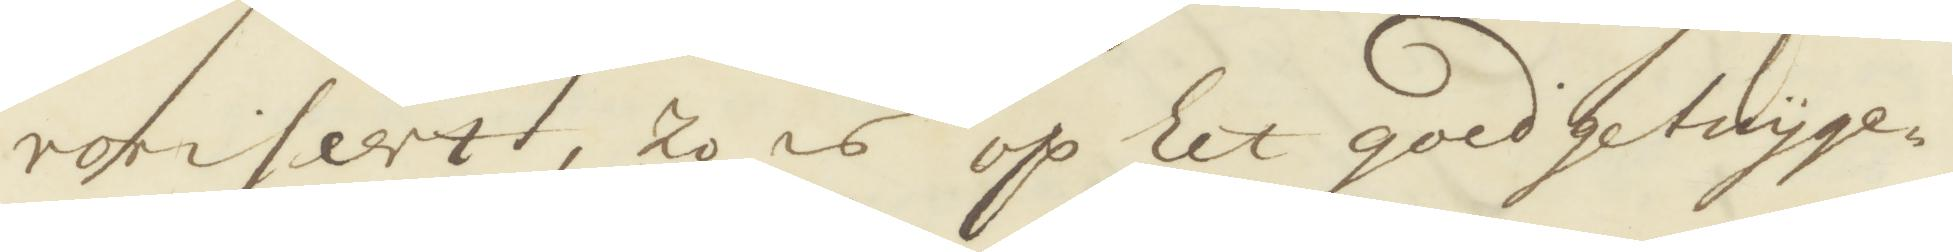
voriseert, zo is op het goed getuijge„
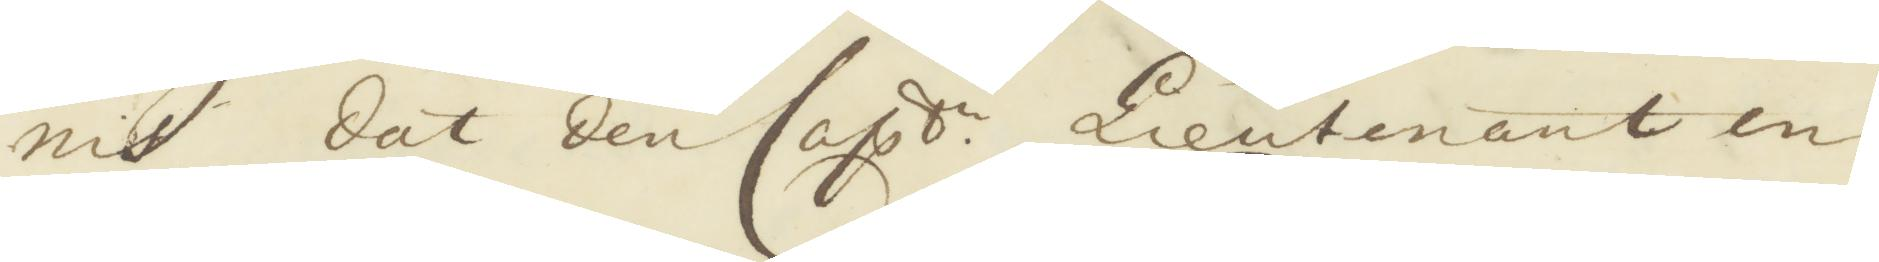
nis dat den Capt.n Lieutenant en
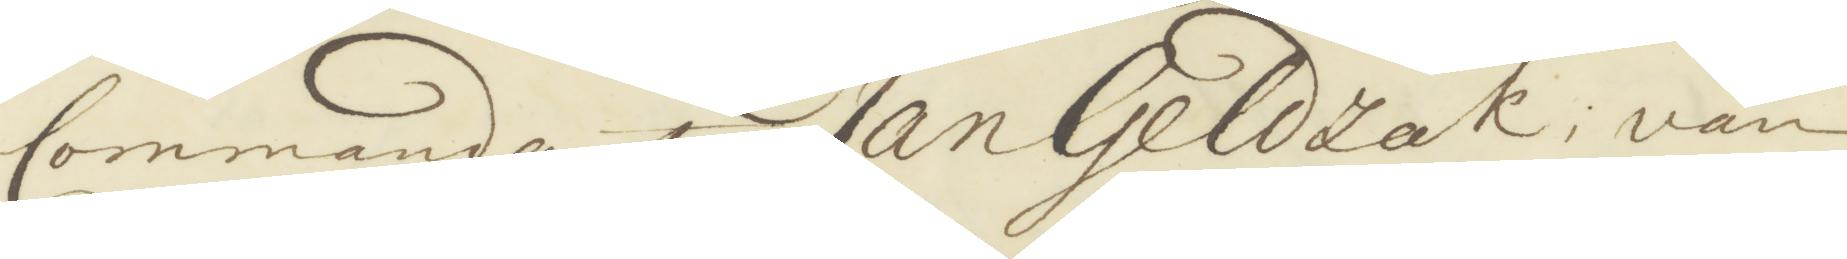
Commandant Jan Geldzak; van
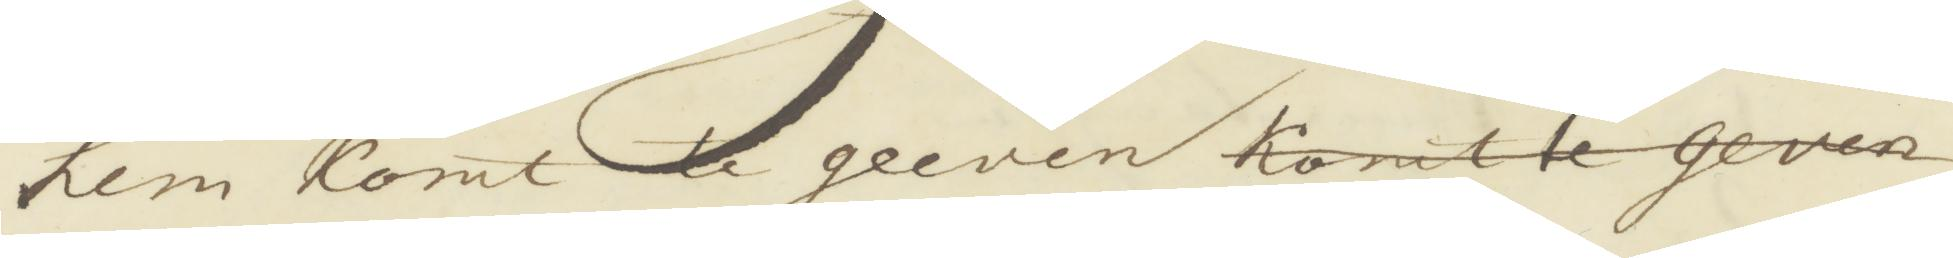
hem komt te geeven komt te geven
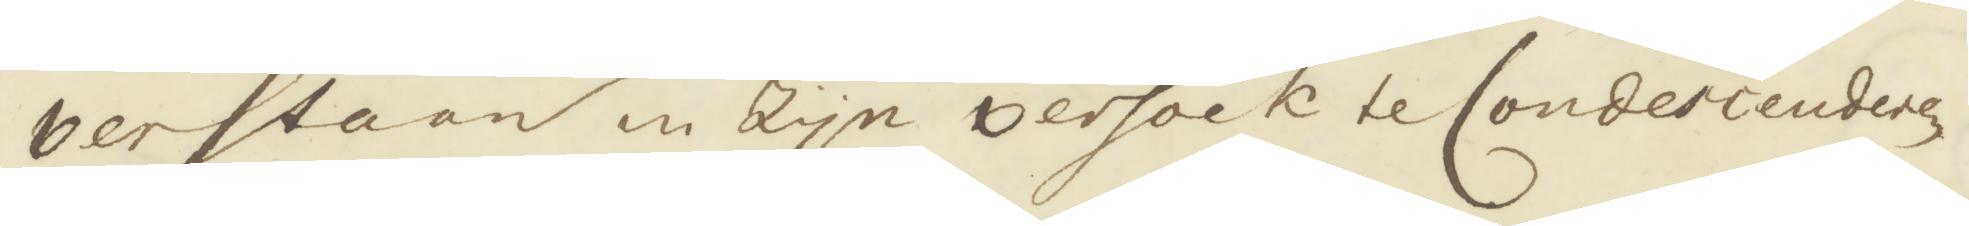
verstaan in zijn versoek te Condescenderen
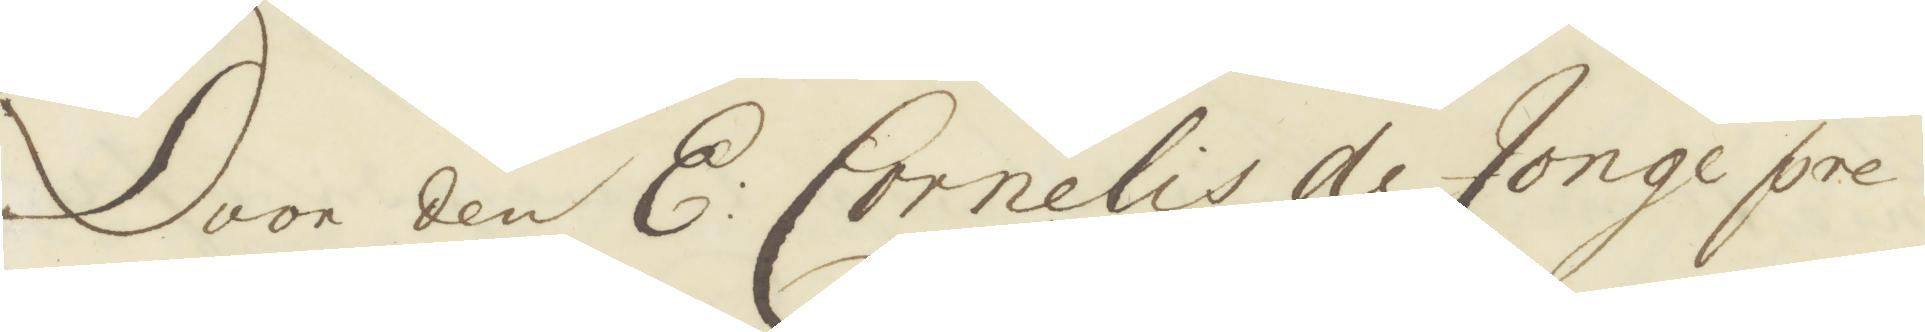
Door den E: Cornelis de Jonge pre
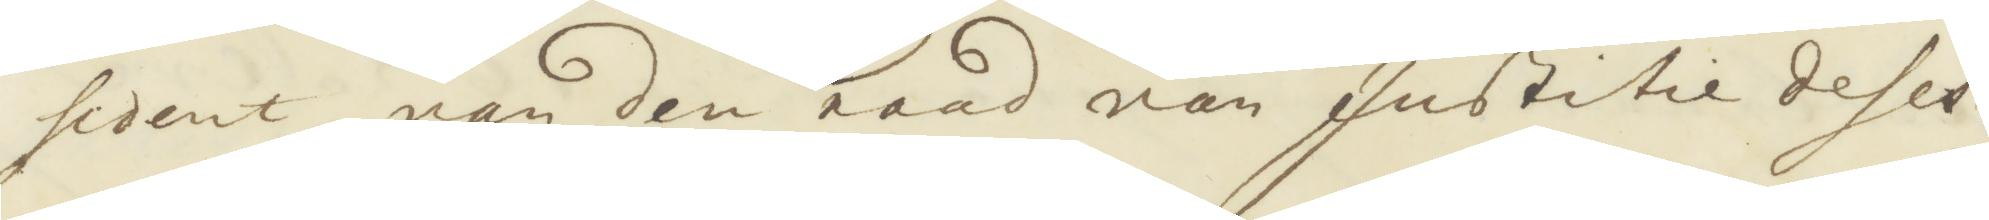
sident van den raad van Justitie deses
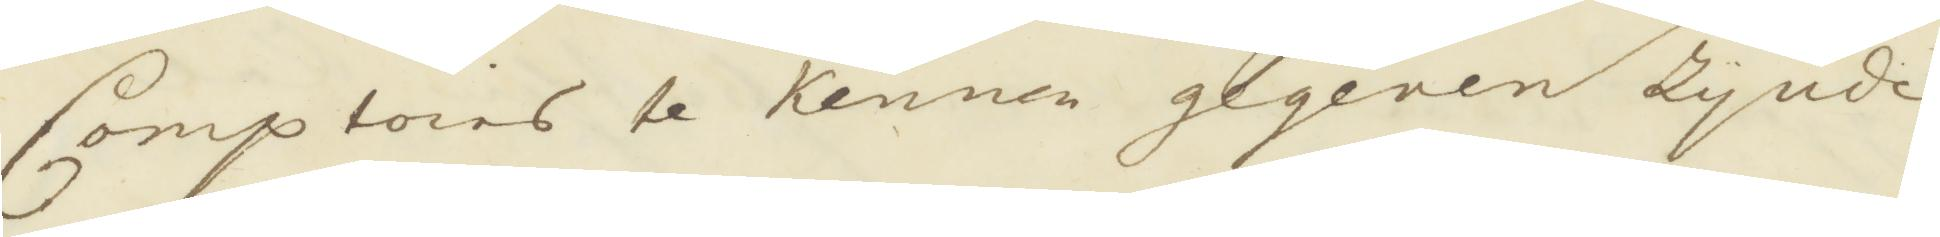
Comptoirs te kennen gegeven zijnde
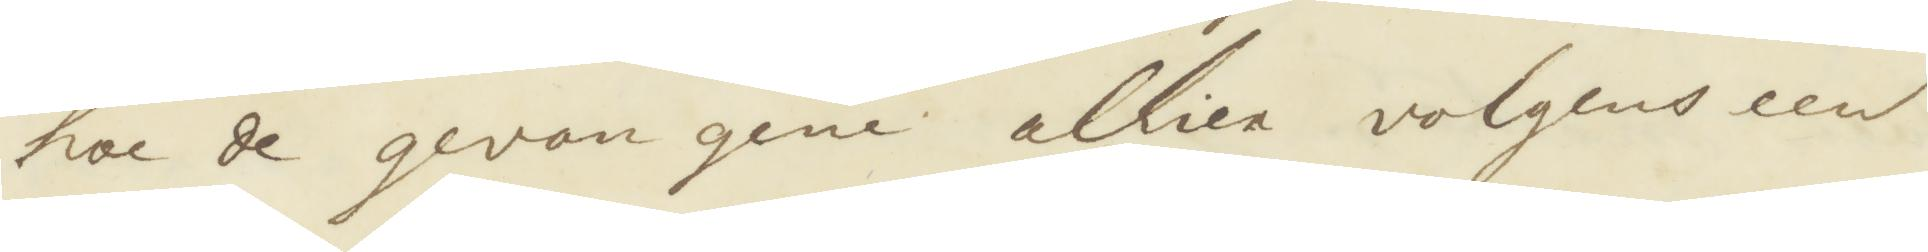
hoe de gevangene alhier volgens een
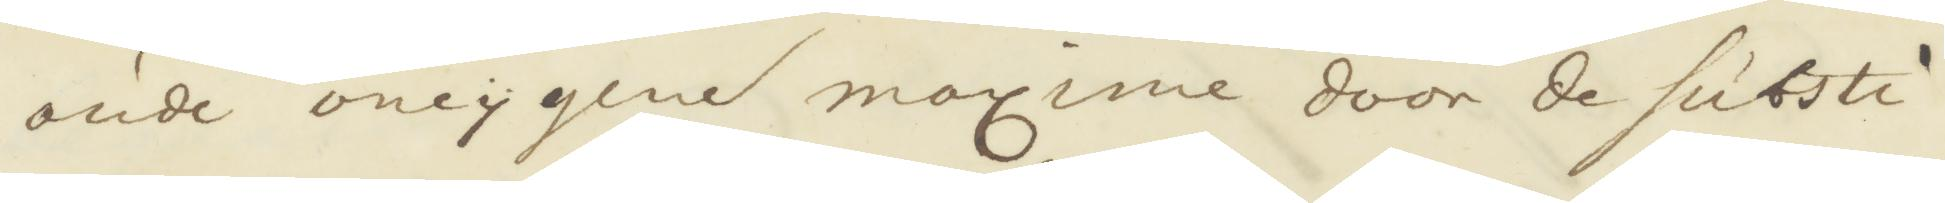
oude oneijgene maxime door de substi
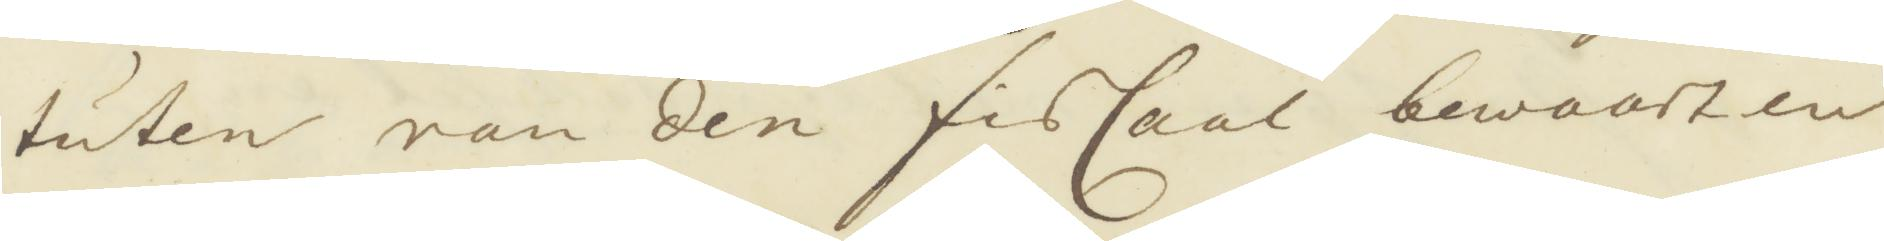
tuten van den fiscaal bewaart en
